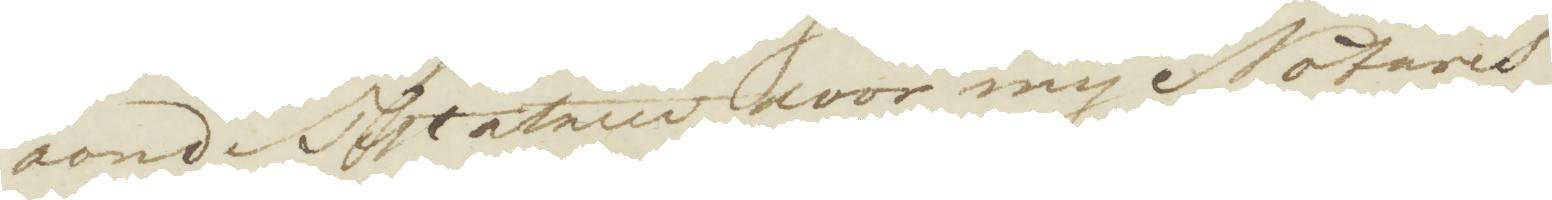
aan de Testatrice door my Notaris
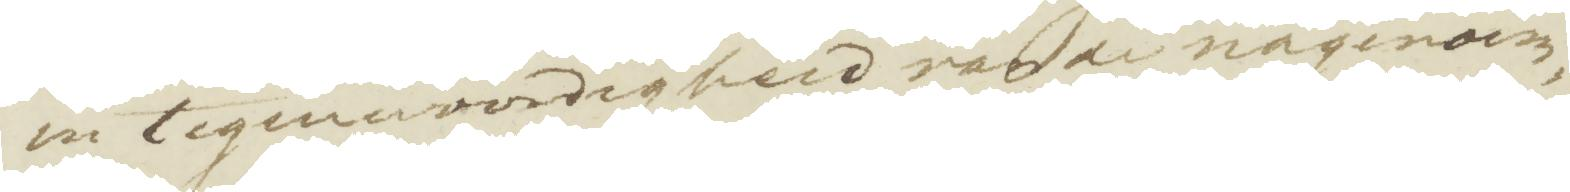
in tegenwoordigheid van de nagenoem
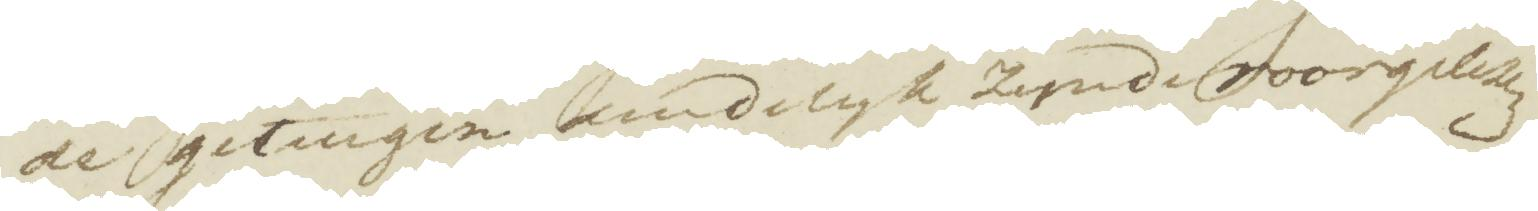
de getuigen duidelyk zynde voorgelezen
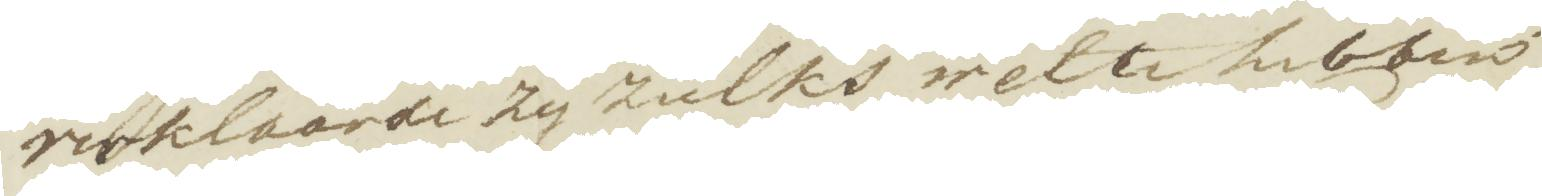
verklaarde zij zulks welte hebben
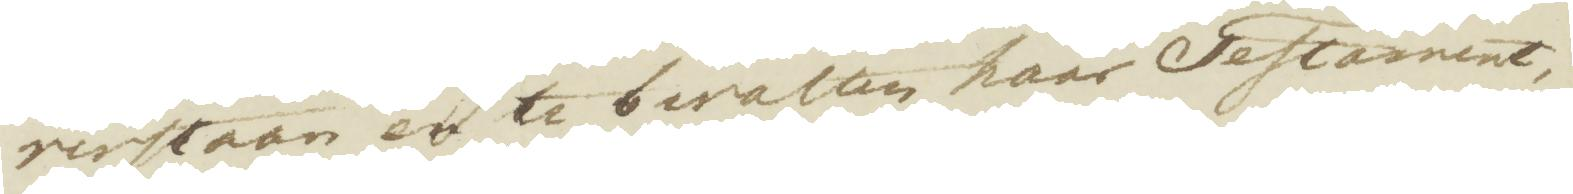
verstaan en te bevatten haar Testament,
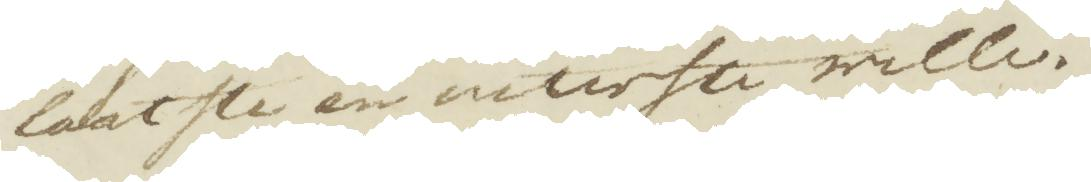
laatste en uiterste wille.
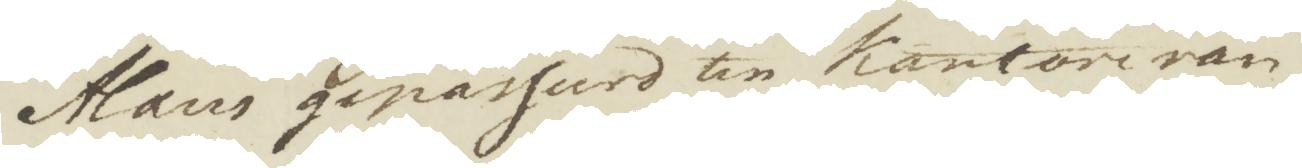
Aldus gepasseerd ten Kantore van
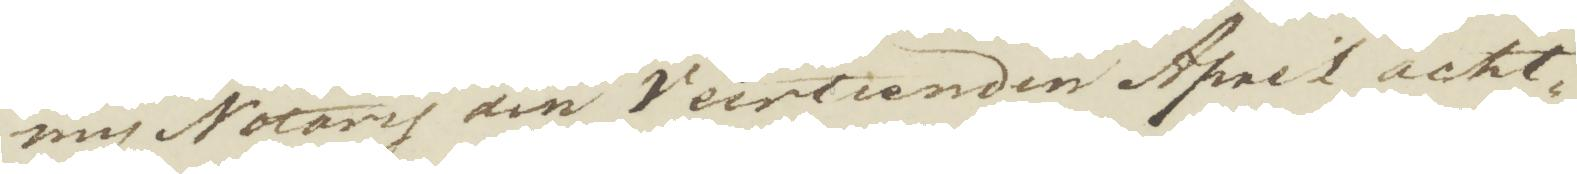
my Notaris den Veertienden April acht„
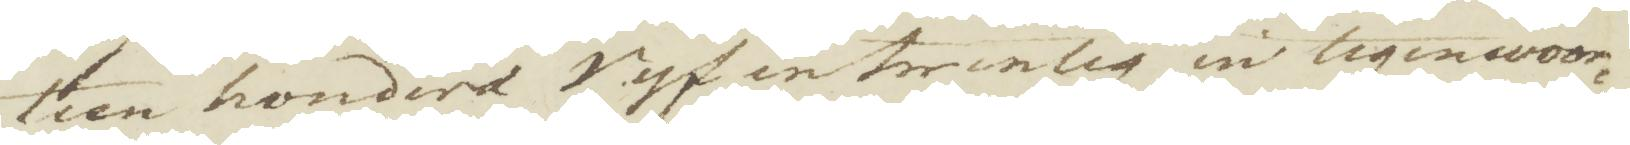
tien honderd Vijf entwintig in tegenwoor„
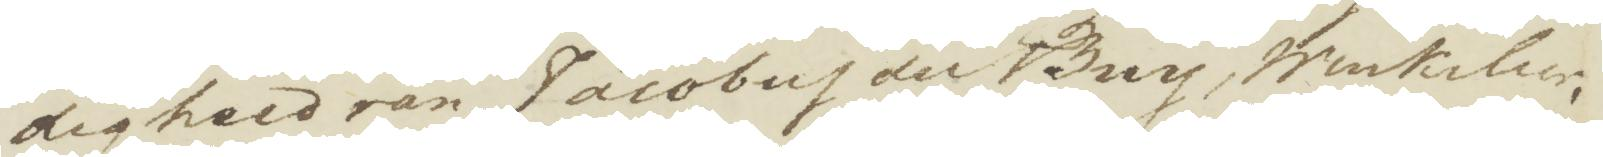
digheid van Jacobus du Buy, Winkelier,
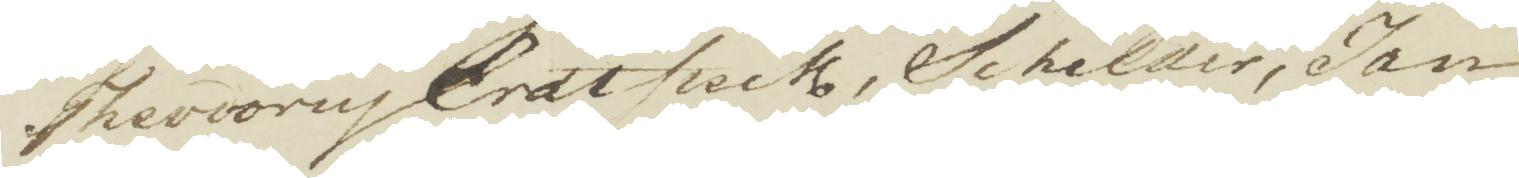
Theodorus Erdtsieck, Schilder, Ian
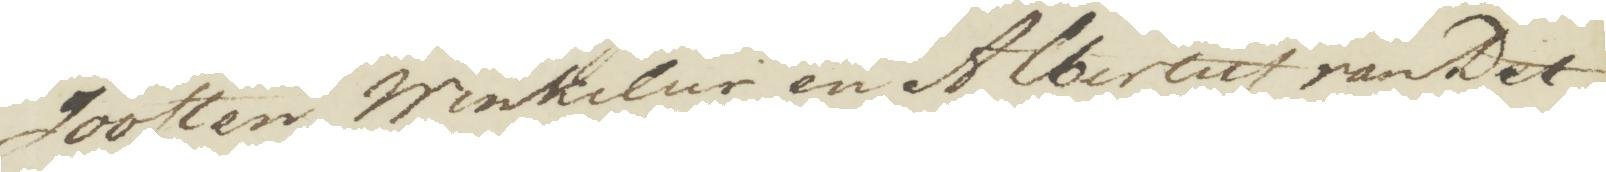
Joosten Winkelier en Albertus van Det
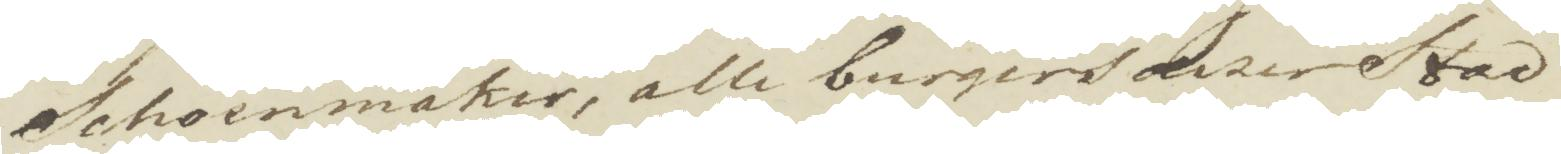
Schoenmaker, alle burgers dezer Stad
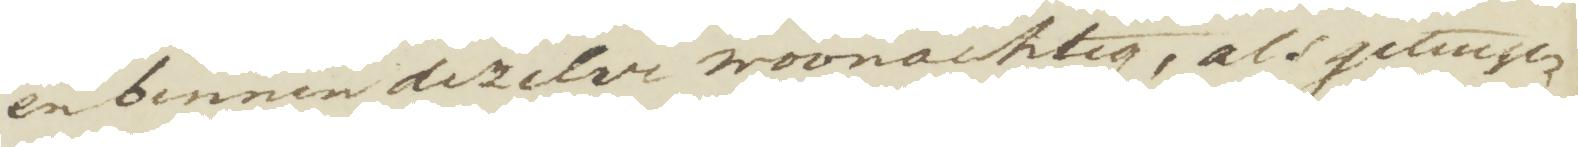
en binnen dezelve woonachtig, als getuigen
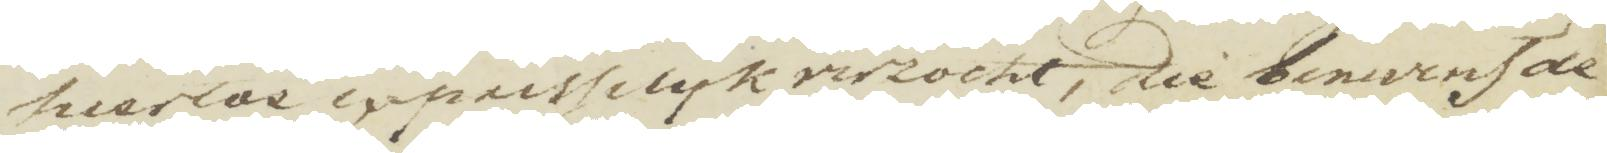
hiertoe expresselyk verzocht, die benevens de
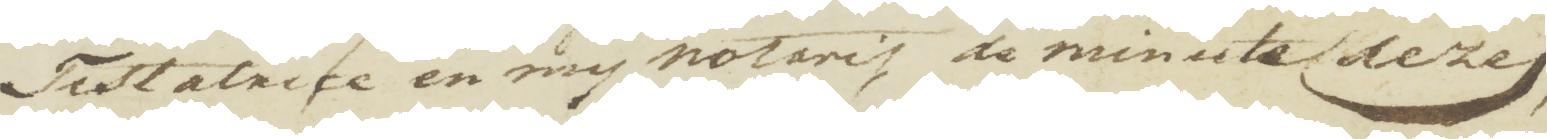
Testatrice en my notaris de minute dezes
